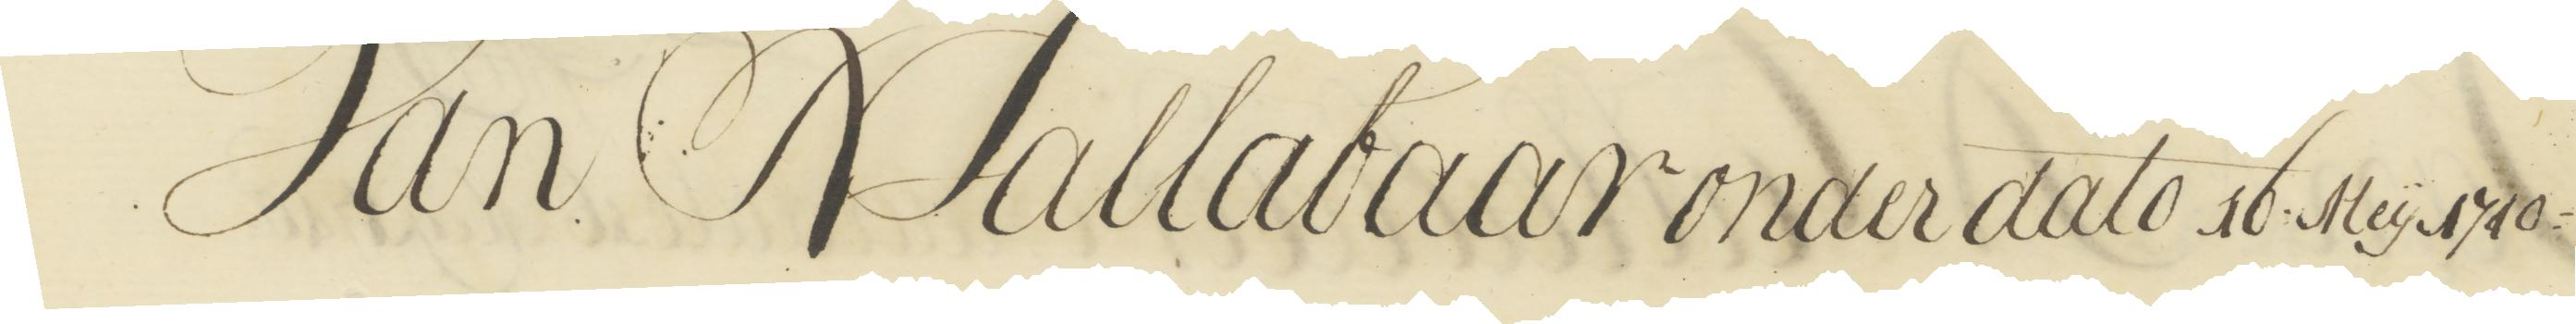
Van Mallabaar onder dato 16: Meij 1740:
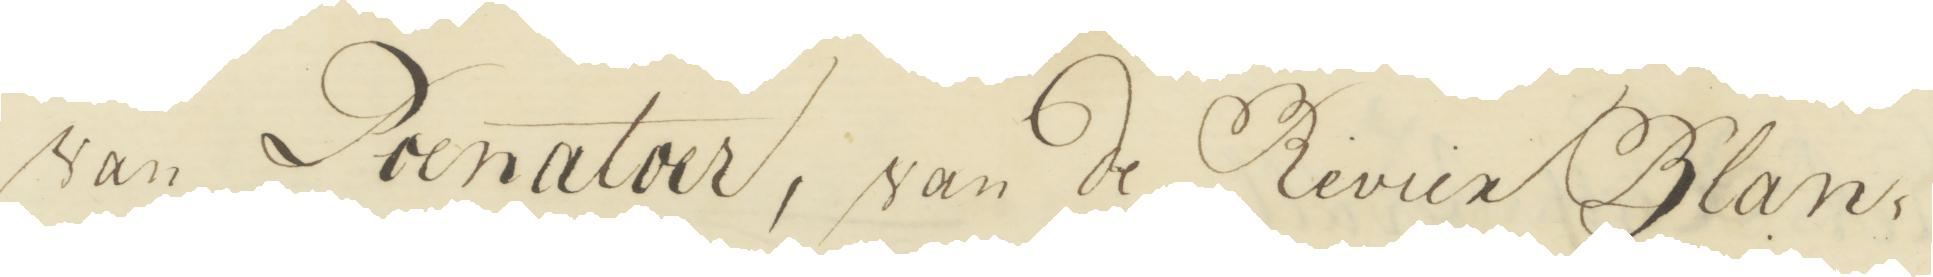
van Poenatoer, van de Revier Blan„
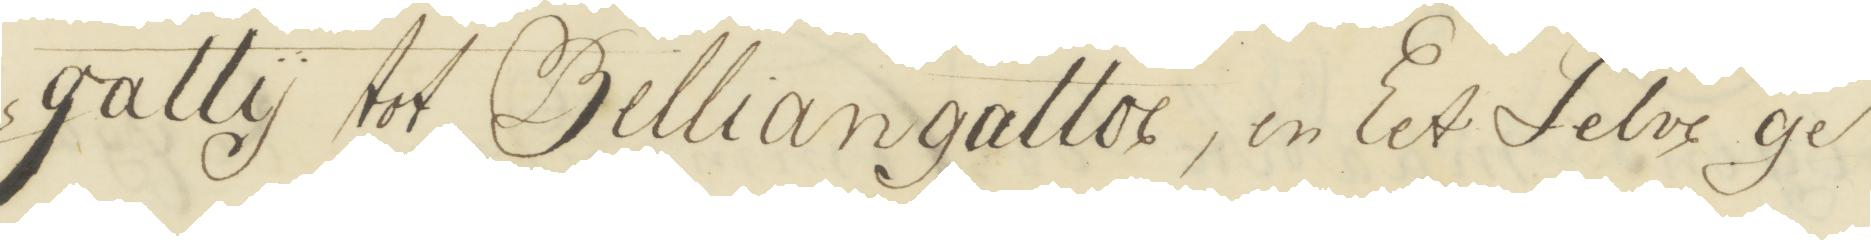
„gattij tot Belliangattoe, en het selve ge
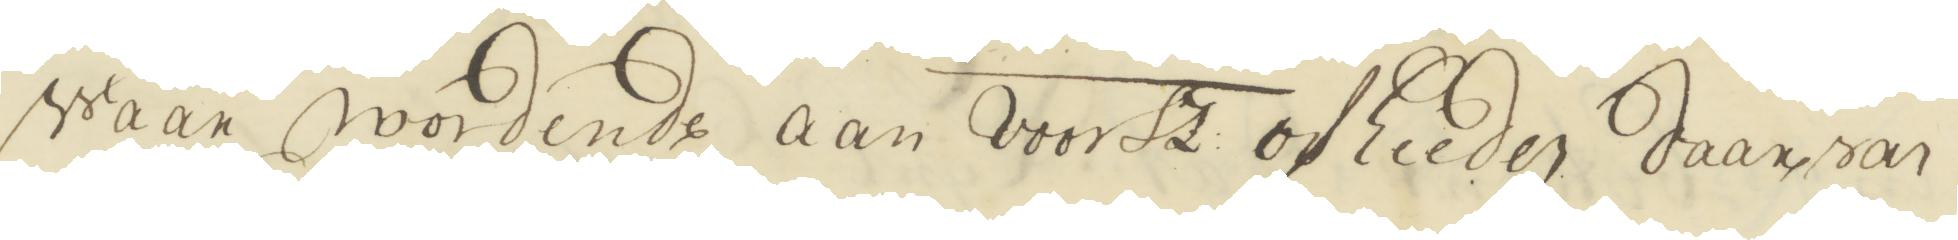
waar wordende aan voorsz: overheeden daar van
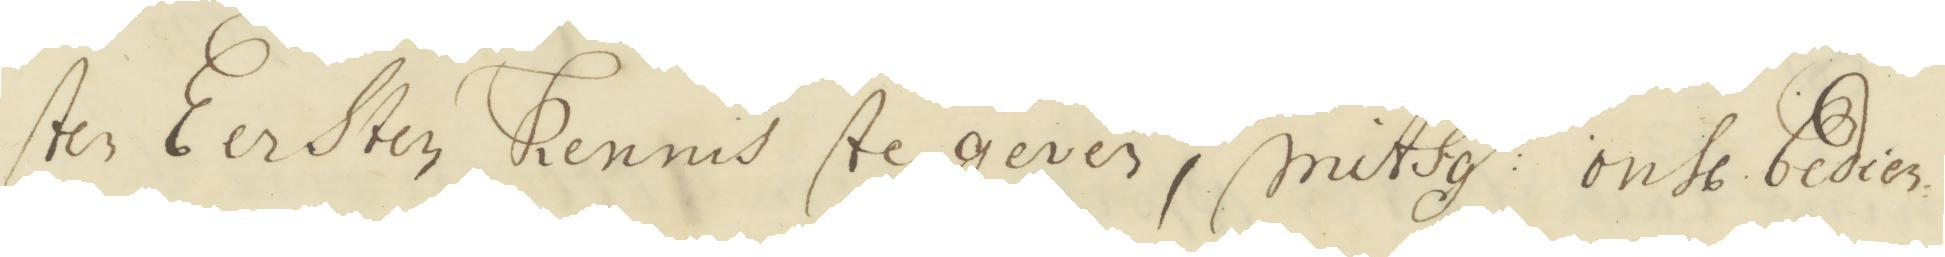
ter Eersten kennis te geven, mitsg:ds onse bedien:
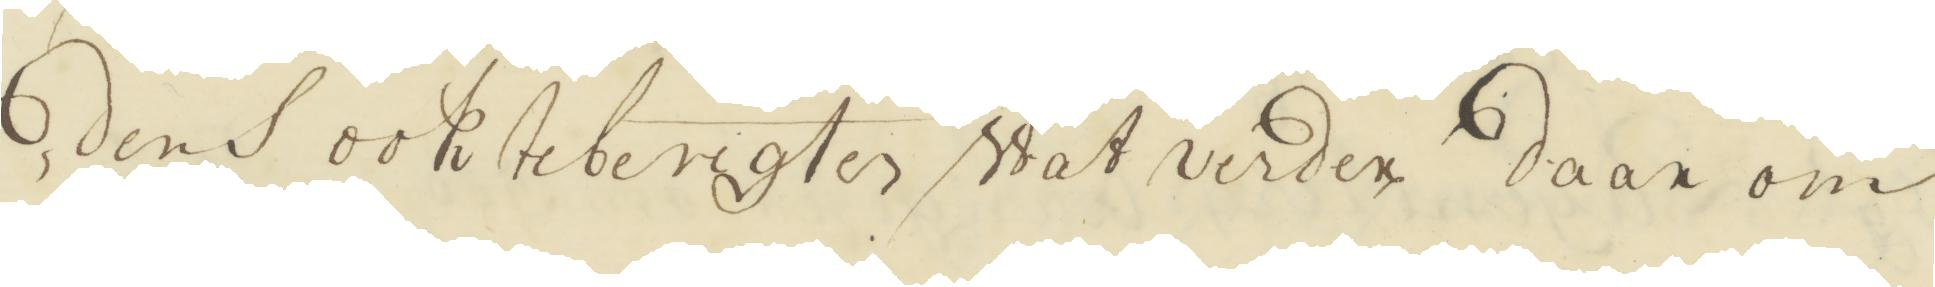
dens ook teberigten wat verder daar om
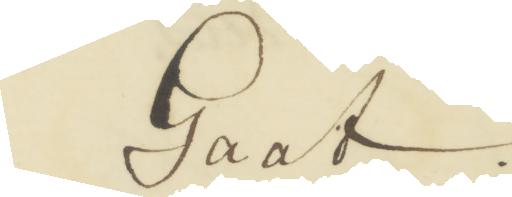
Gaat.
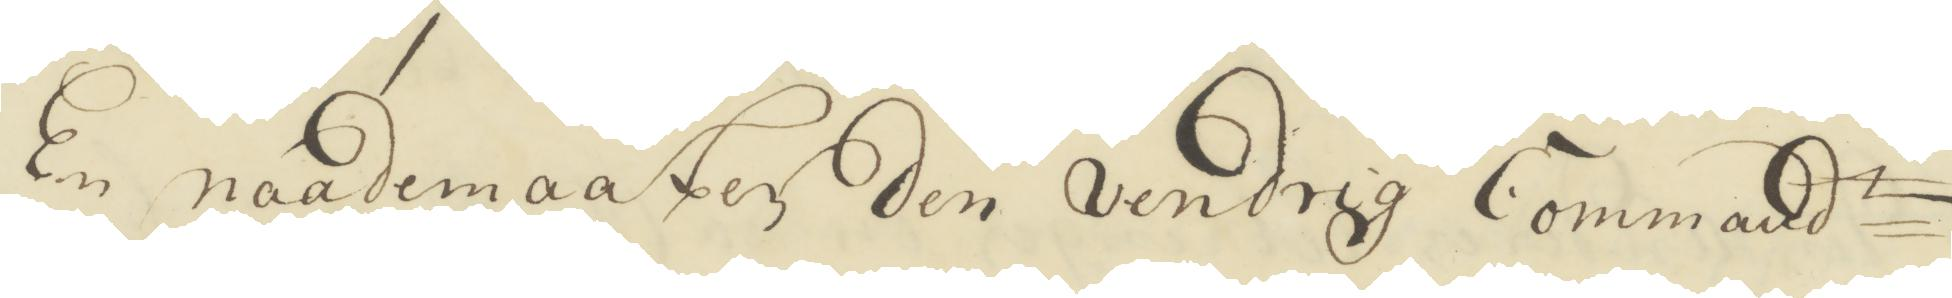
En naademaaten den vendrig Command=t
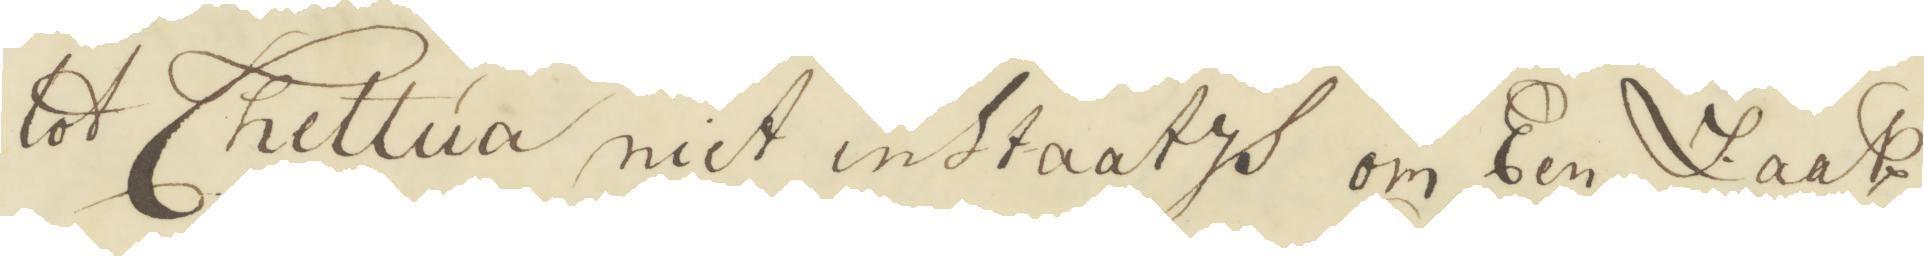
tot Chettua niet instaatjs om Een zaak
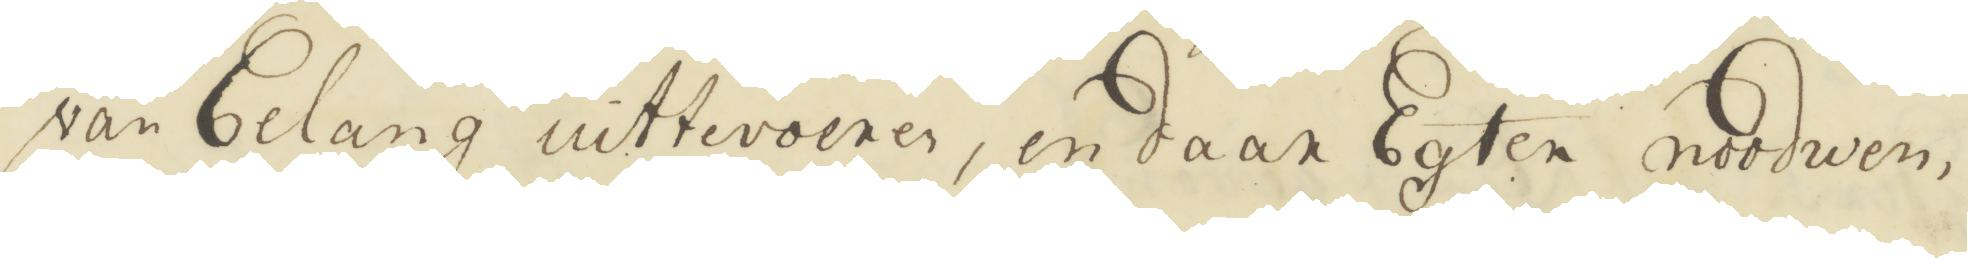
van belang uittevoeren, en daar Egter noodwen,
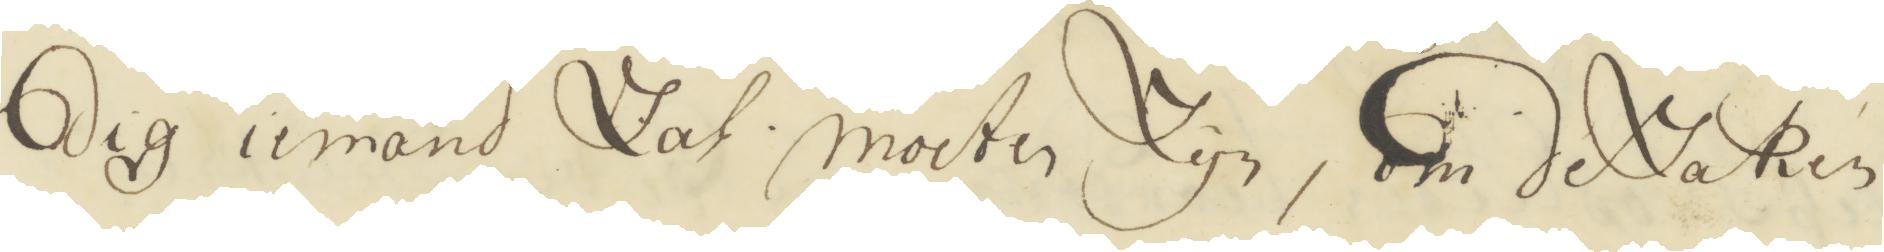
dig iemand zal moeten zijn, om de zaken
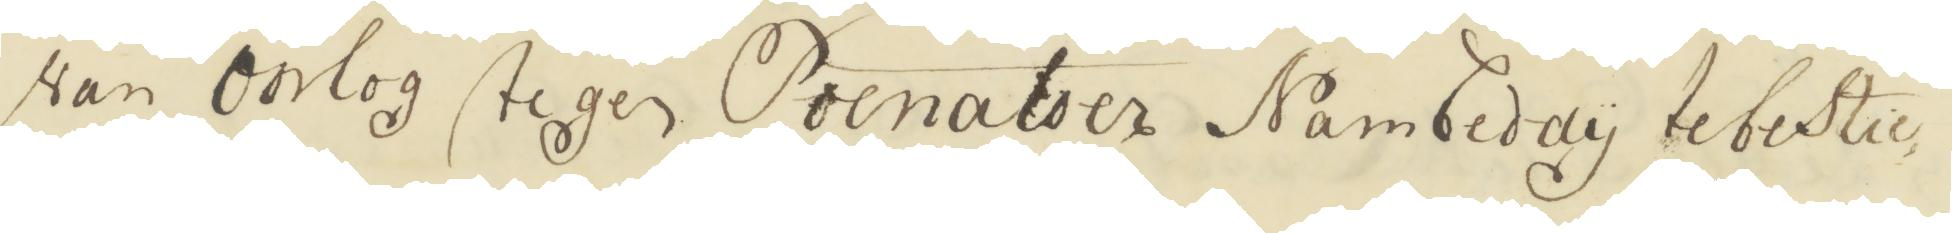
van Oorlog tegen Poenatoer Nambeddij te bestie„
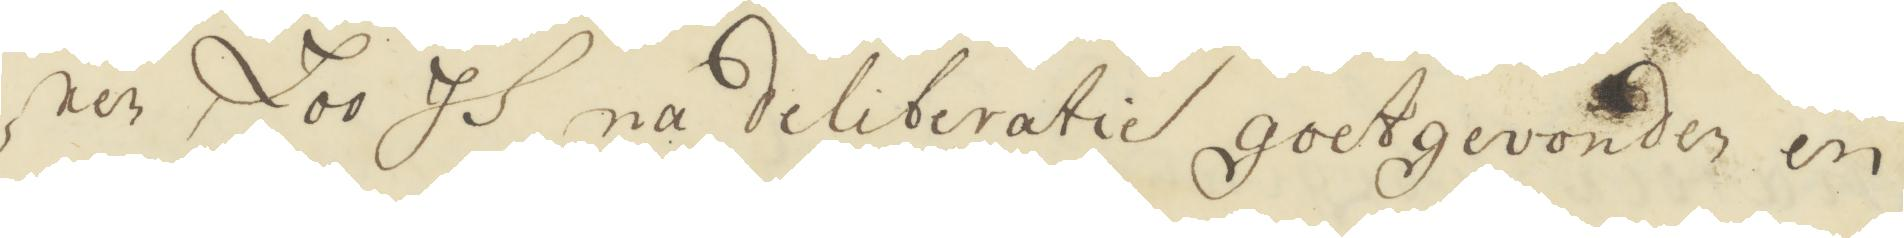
ren, zoo js na deliberatie goetgevonden en
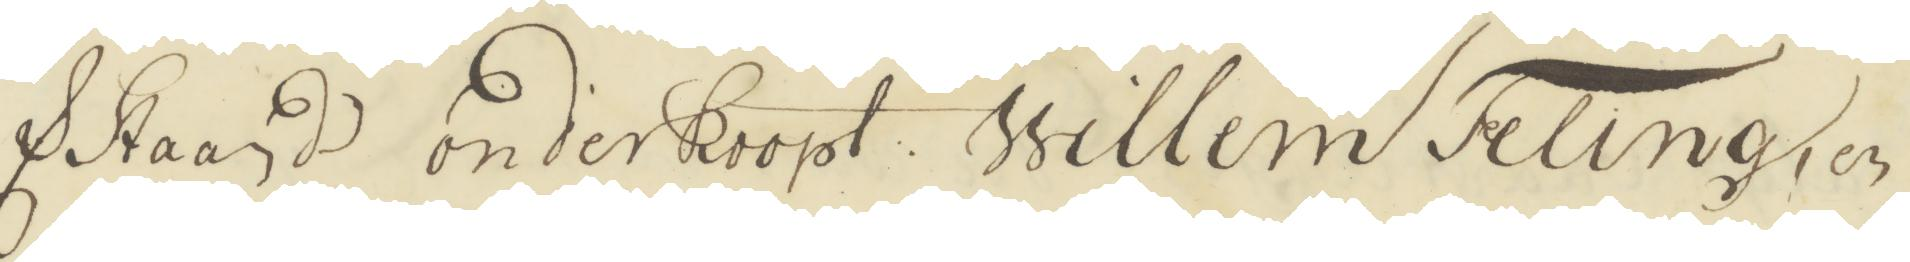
verstaan d onderkoopl: Willem Feling, en
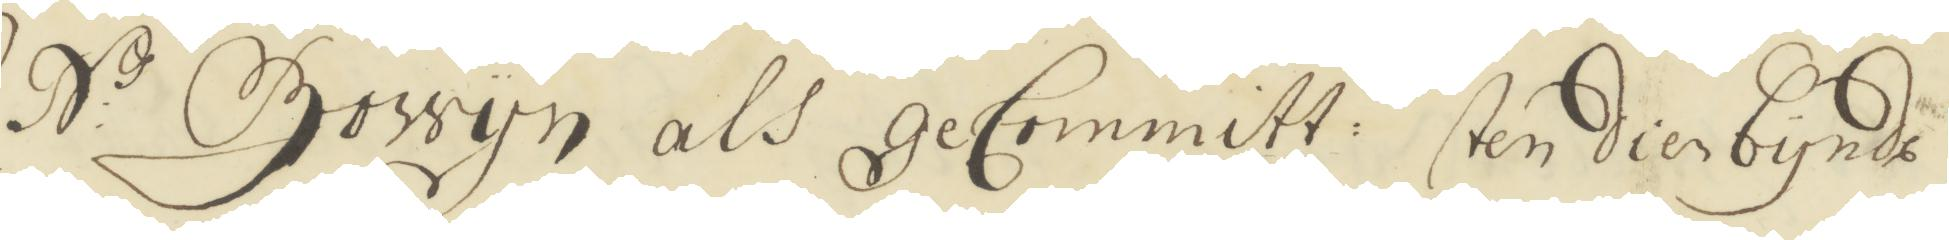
N:s Bowijn als gecommitt:s ten dien Eijnde
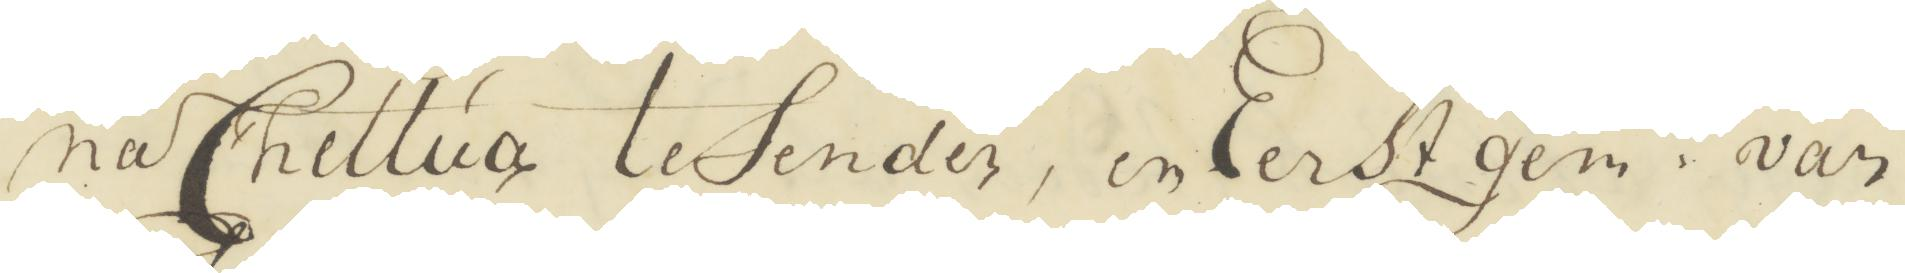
na Chettua te senden, en Eerst gem: van
